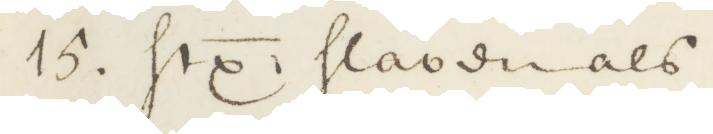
15. stx: slaven als
